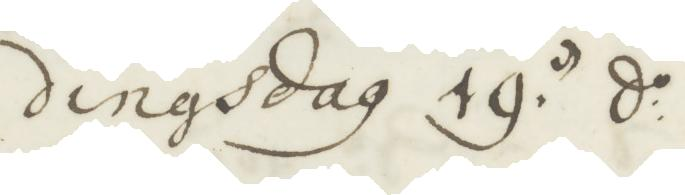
dingsdag 19.en d:o
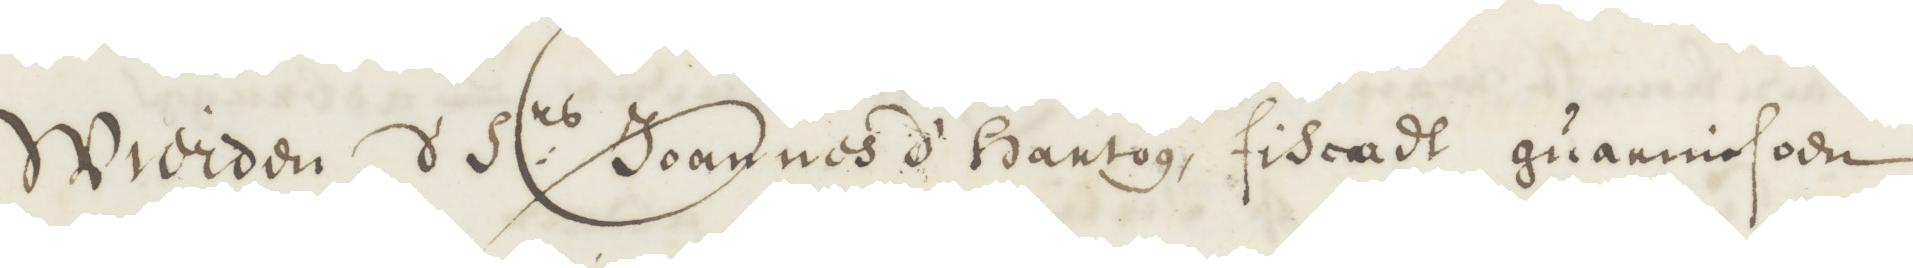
Wierden d’ s:rs Ioannes d’ Hartog, fiscael guarnisoen
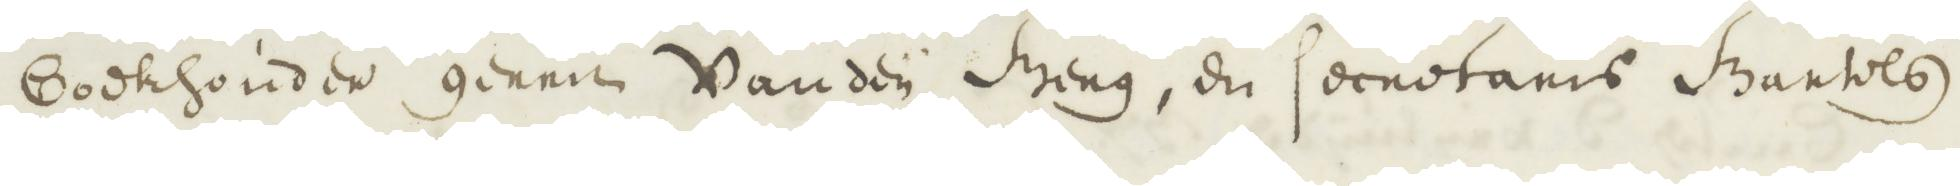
boekhouder gerrit van den Berg, en secretaris Bartels
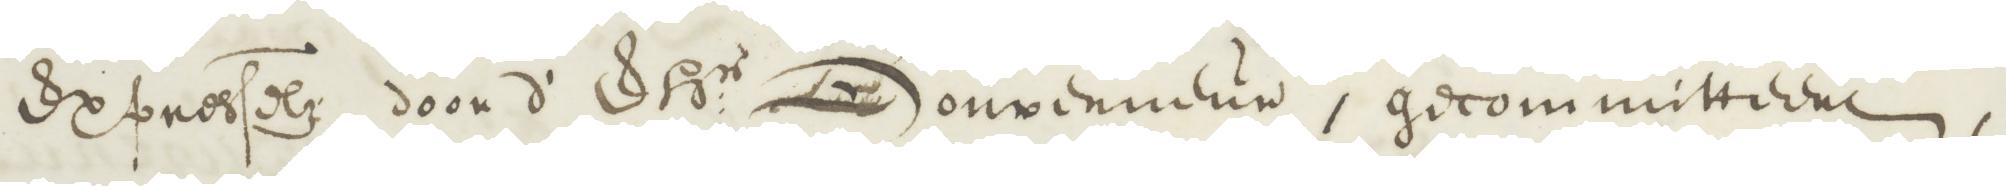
Expresselijk, door d’ E H:r Gouverneur, gecommitteert,
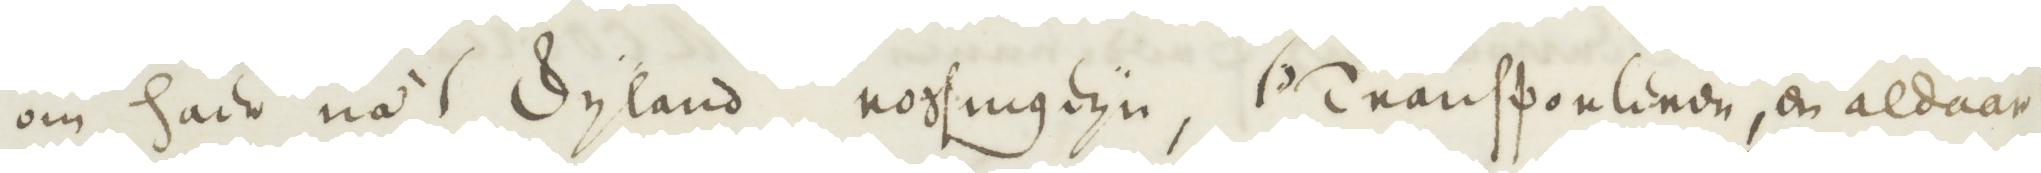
om haer na ’t Eijland rossingeijn, t' Transporteren, en aldaar
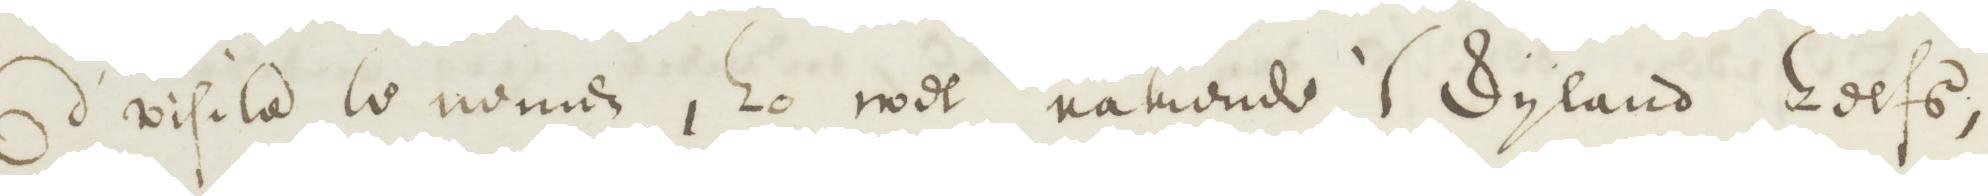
d’ visite te nemen, zo wel rakende 't Eijland zelfs,
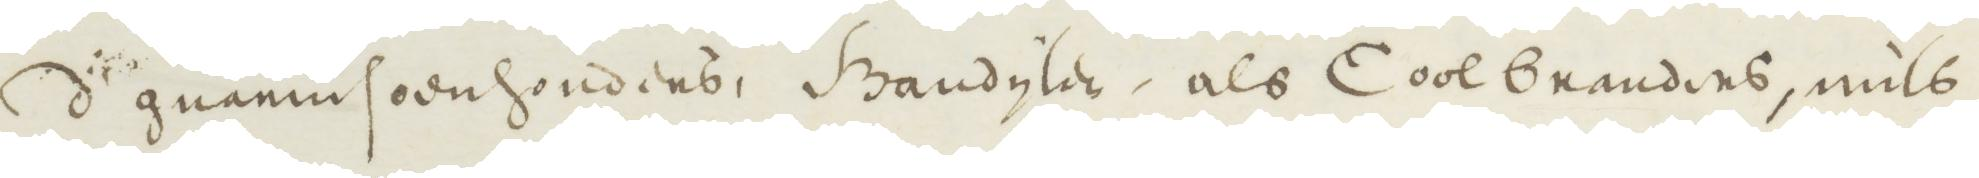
d’ guarinsoenhouders, Bandijter, als Cool branders, mits
